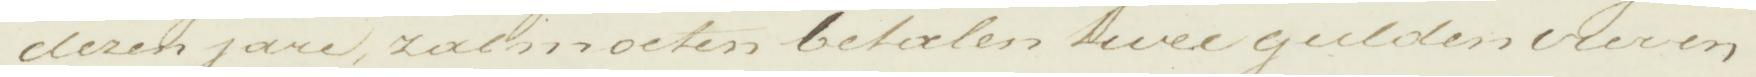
dezen jare, zal moeten betalen twee gulden vier en
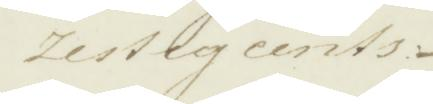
zestig cents:
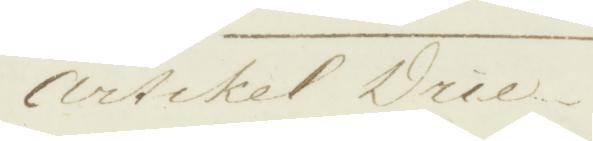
Artikel Drie. _
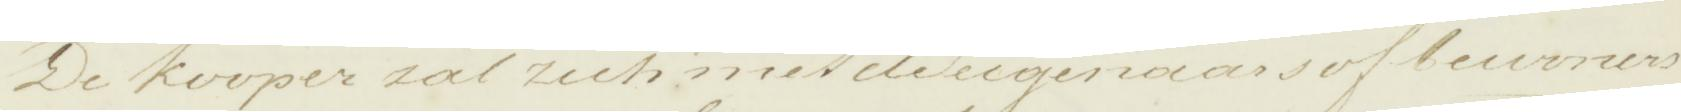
De kooper zal zich met de eigenaars of bewoners
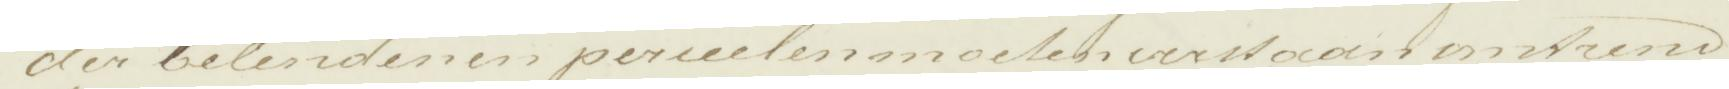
der belendenen perceelen moeten verstaan omtrend
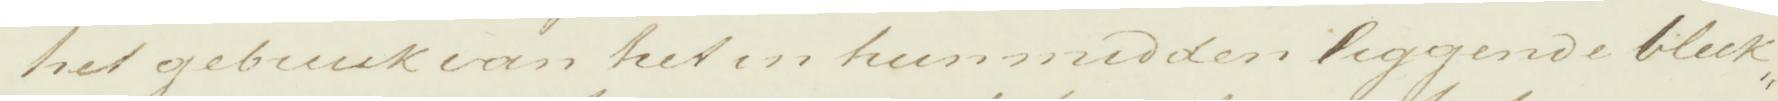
het gebruik van het in hun midden liggende bleek
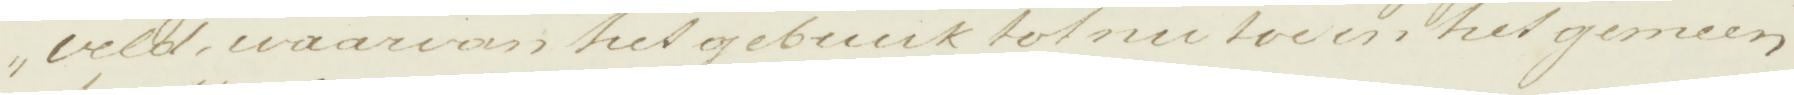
„veld, waarvan het gebruik tot nu toe in het gemeen
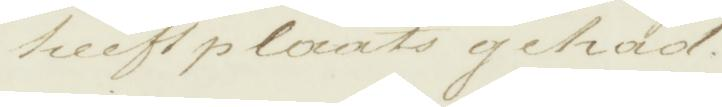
heeft plaats gehad
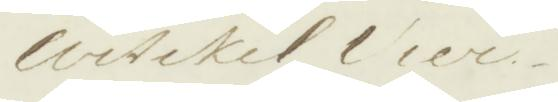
Artikel Vier. _
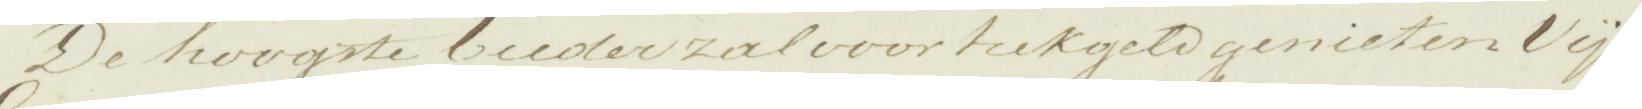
De hoogste bieder zal voor trekgeld genieten Vijf
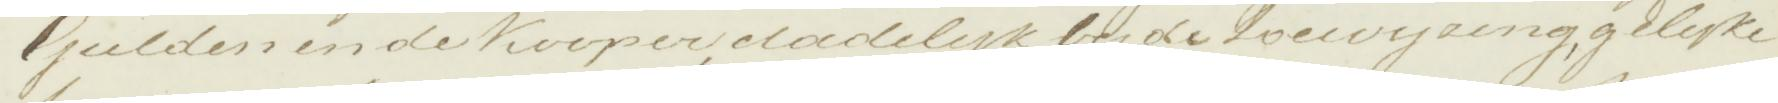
Gulden en de Kooper, dadelyk by de toewyzing gelyke
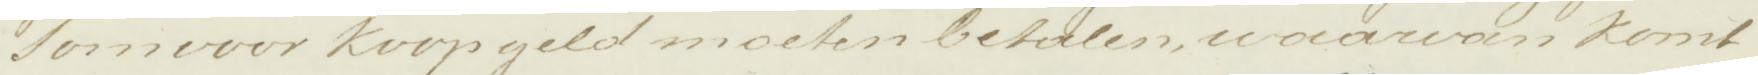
som voor koopgeld moeten betalen, waarvan komt
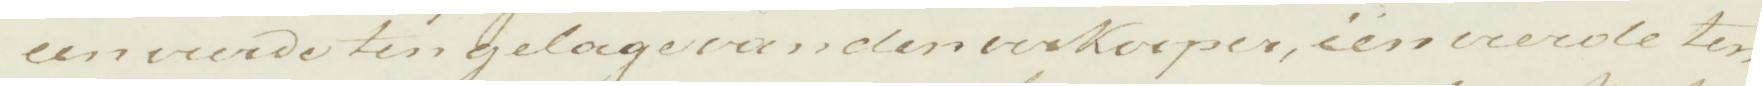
een vierde ten gelage van den verkooper, één vierde ten
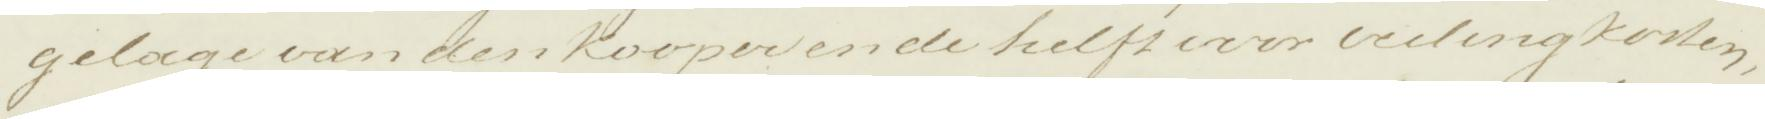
gelage van den Kooper en de helft voor veiling kosten,
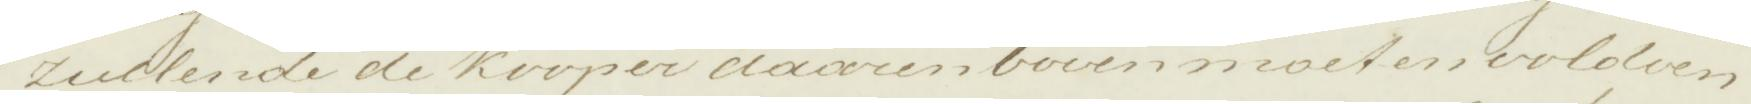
zullende de kooper daarenboven moeten voldoen
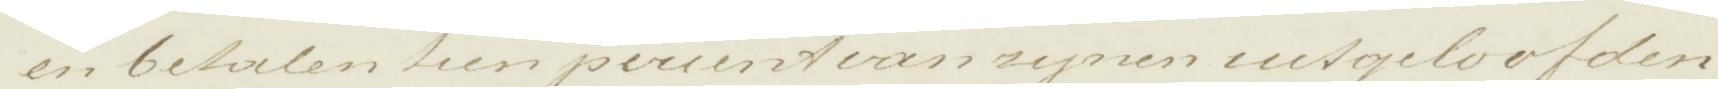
en betalen tien percent van zynen uitgeloofden
